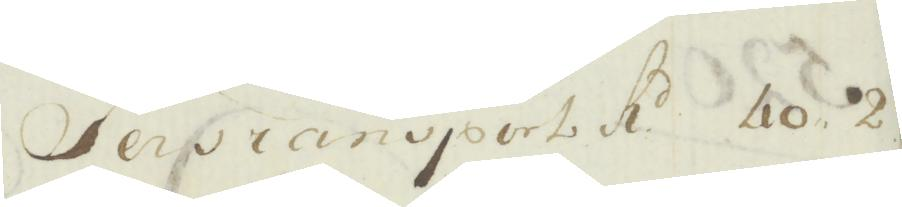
Per Transport R.d 40„ 2
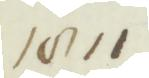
1811
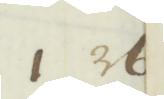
1 3
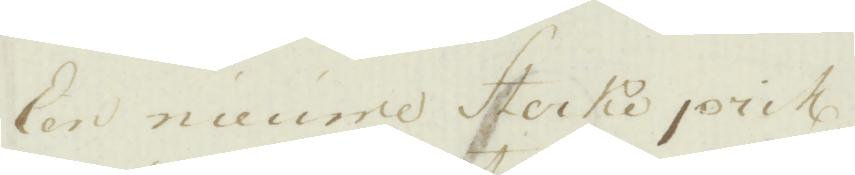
Een nieuwe sterke prik
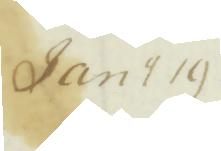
Ian 119
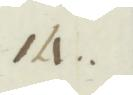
14..
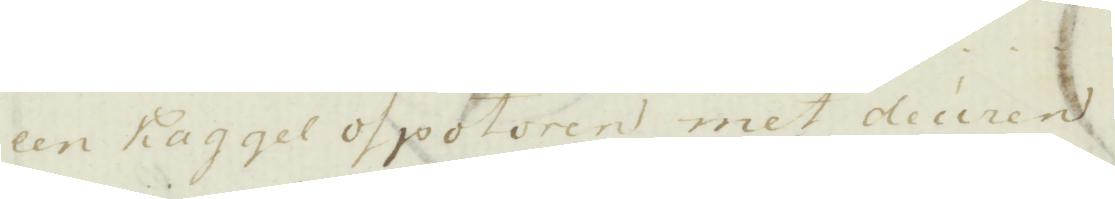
een Kaggel of potoren met deuren
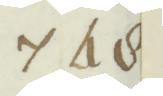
748
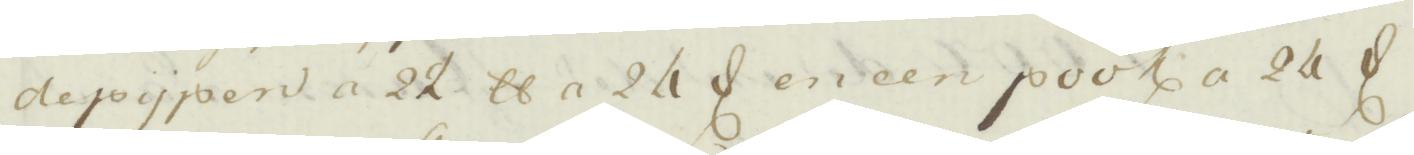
de pijpen a 22 lb a 24 st en een pook a 24 st
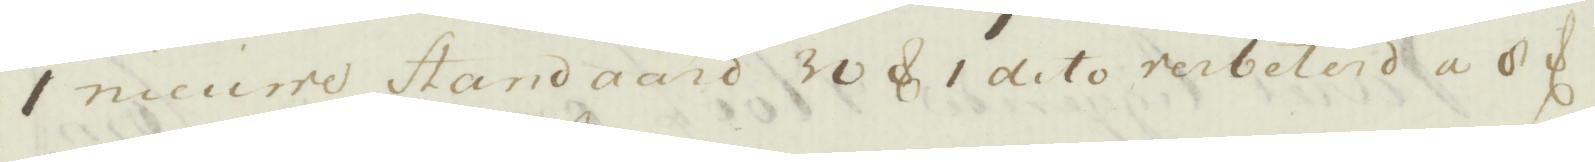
1 nieuwe standaard 30 st 1 dito verbeterd a 8 st
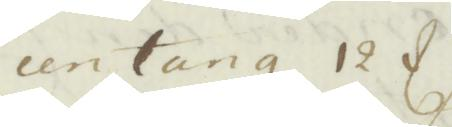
een tang 12 st
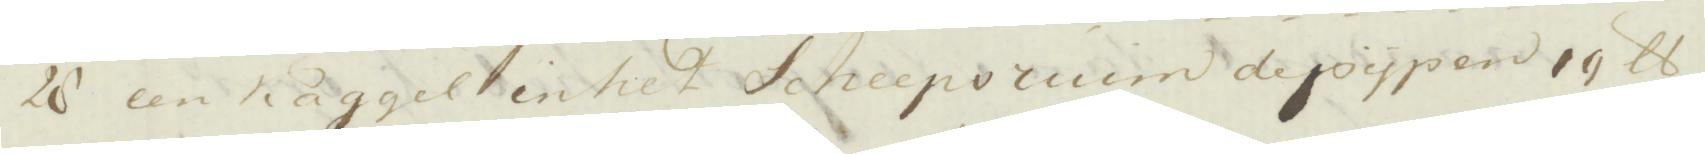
28 een Kaggel in het scheepsruim de pijpen 19 lb
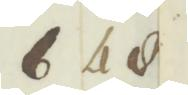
648
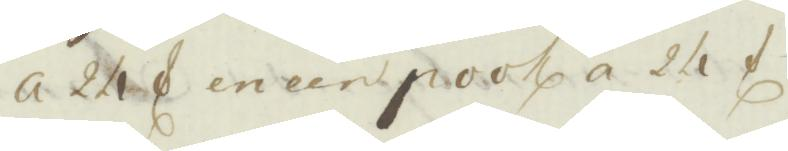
a 24 st en een pook a 24 st
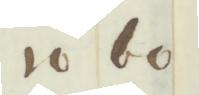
10 60
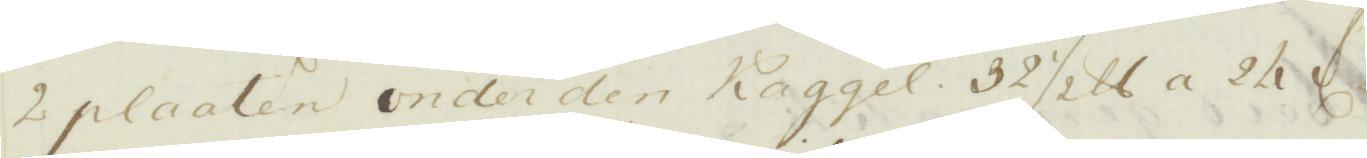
2 plaaten onder den Kaggel. 32½ lb a 24 st
